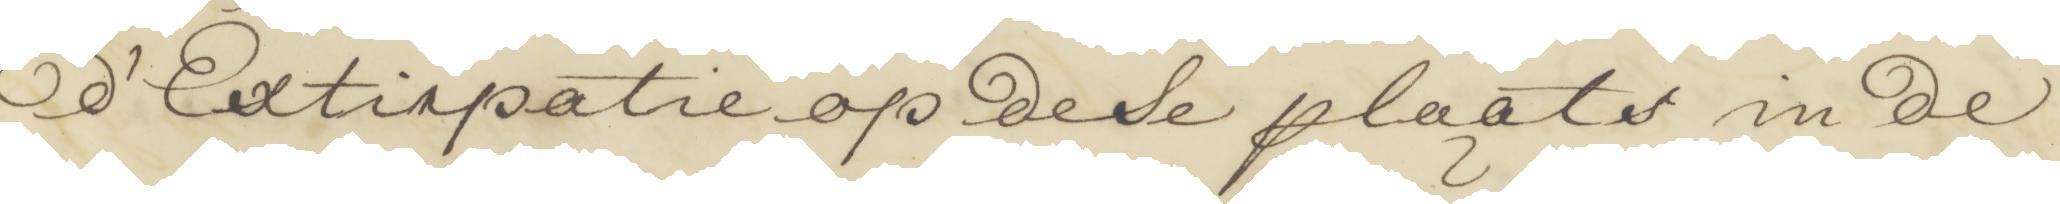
d’Extirpatie op dese plaats in de
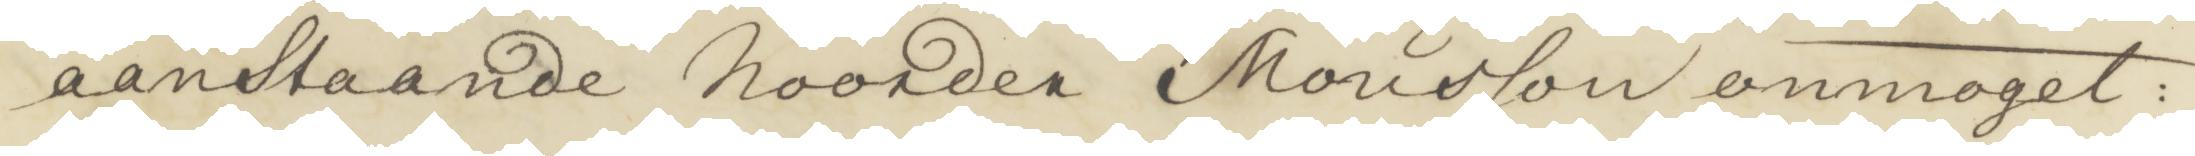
aanstaande noorder Mousson onmogel:
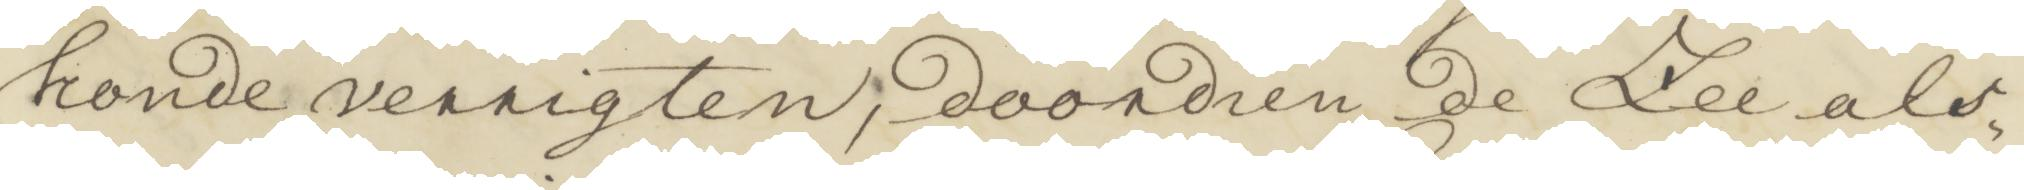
konde verrigten, doordien de zee als„
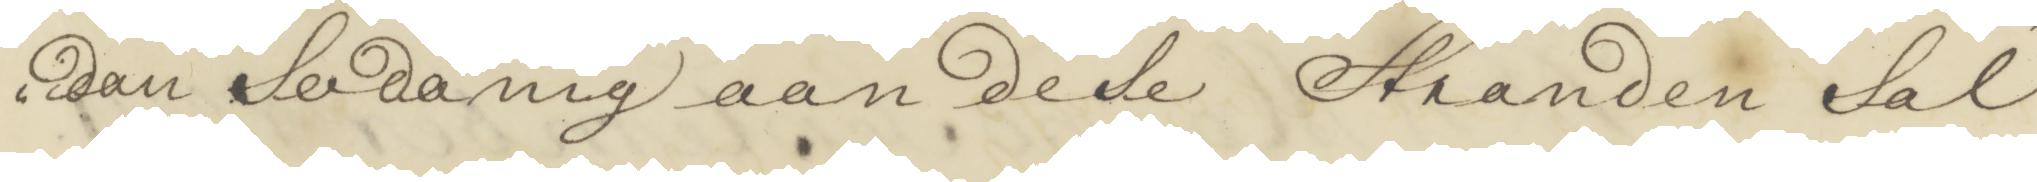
dan sodanig aan dese stranden sal
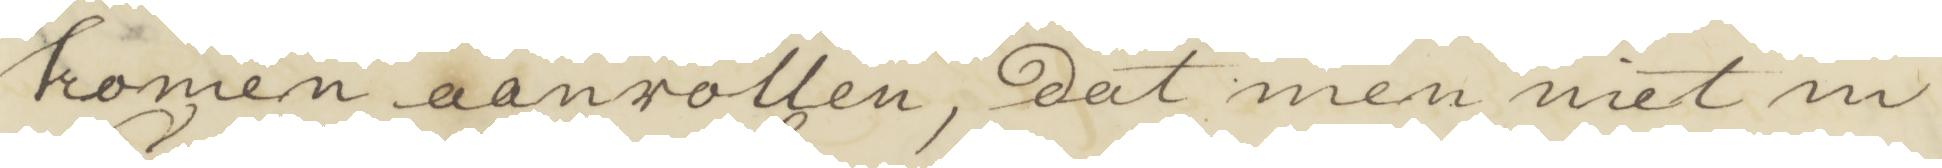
komen aanrollen, dat men niet in
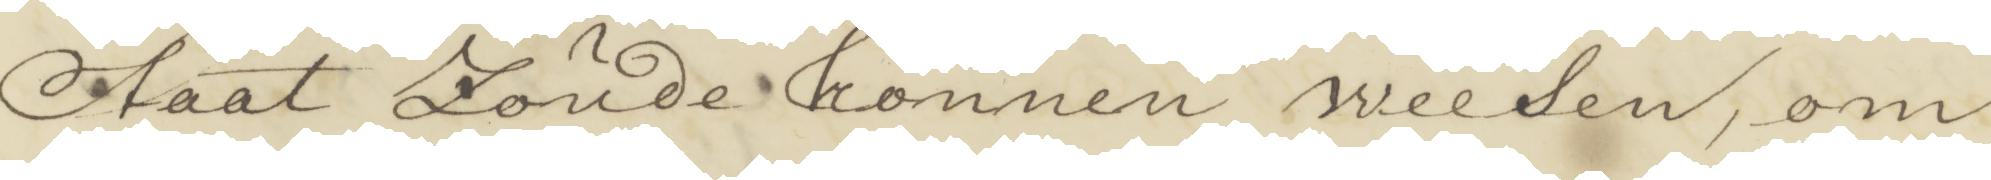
staat zoude konnen weesen, om
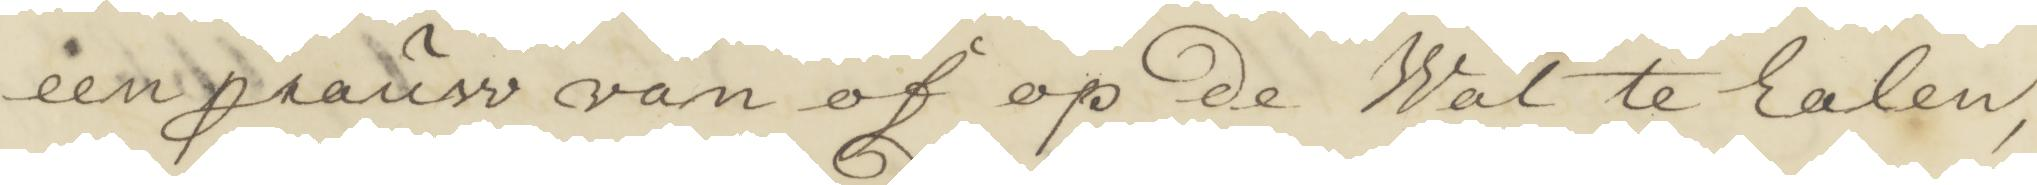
een prauw van of op de Wal te halen,
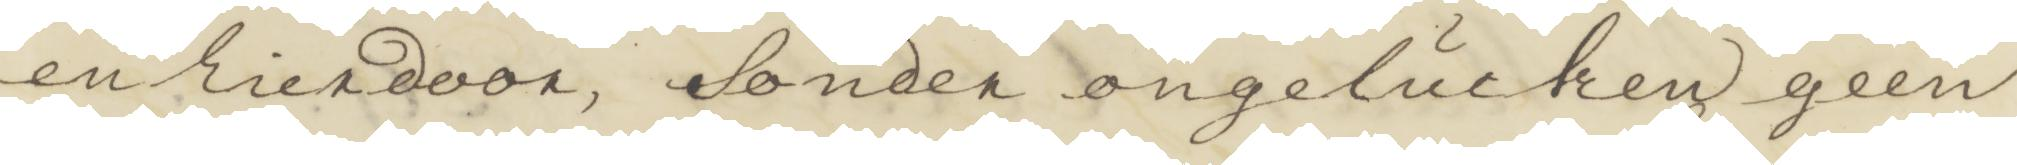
en hierdoor, sonder ongelucken geen
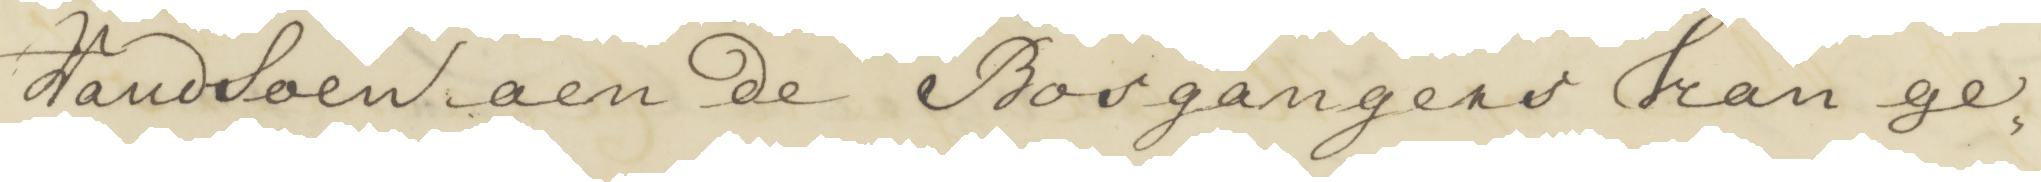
Randsoen aen de Bosgangers kan ge„
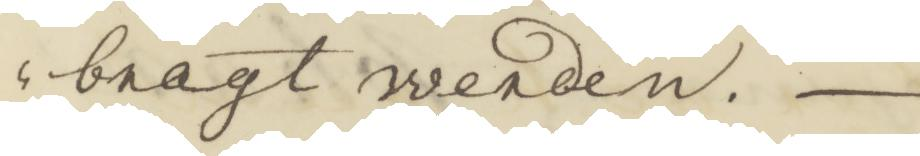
„bragt werden. —
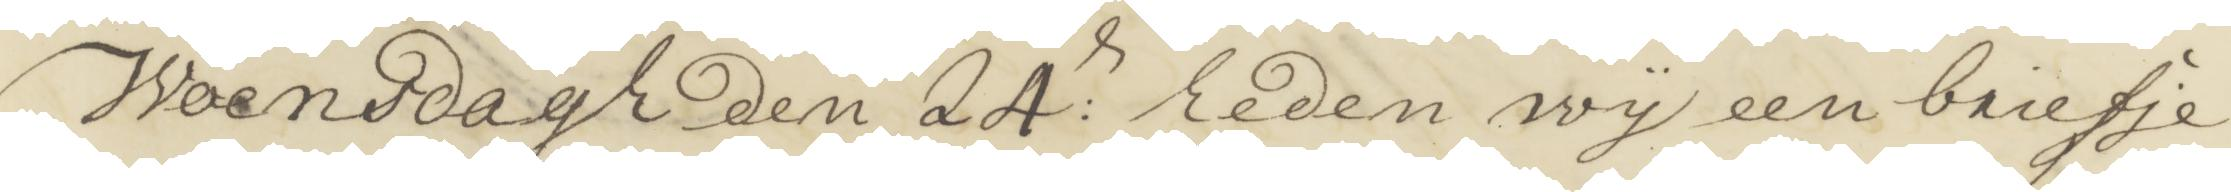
Woensdagh den 24:' heden wij een briefje
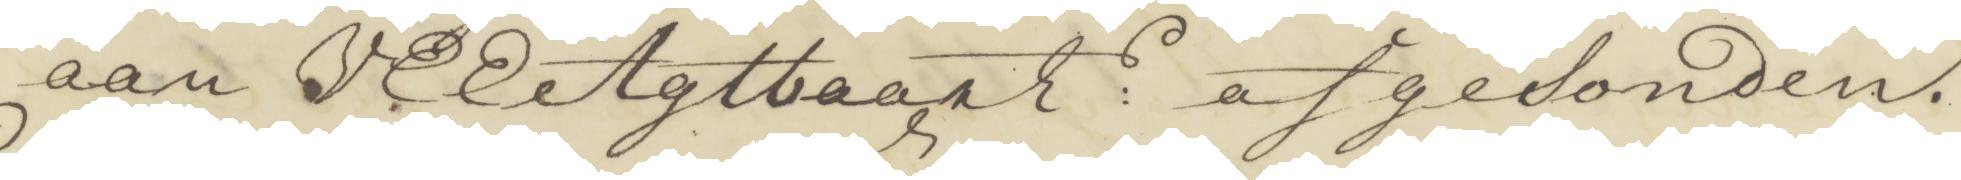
aan VEE Agtbaarh:s afgesonden.
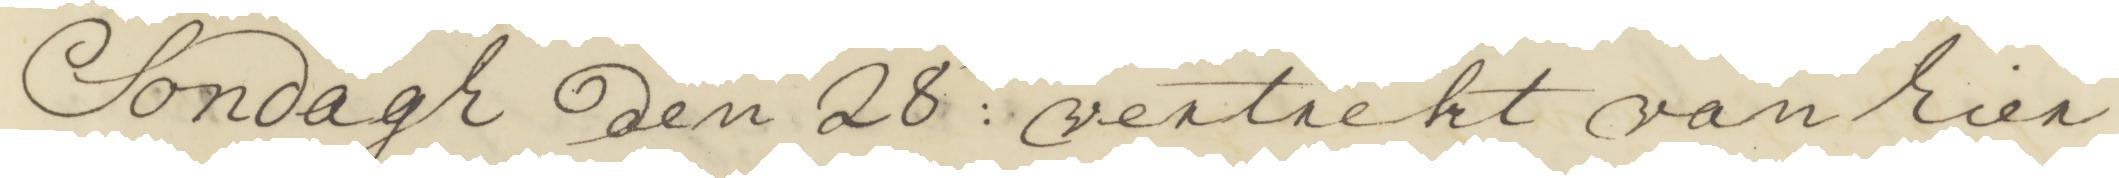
sondagh den 28:' vertrekt van hier
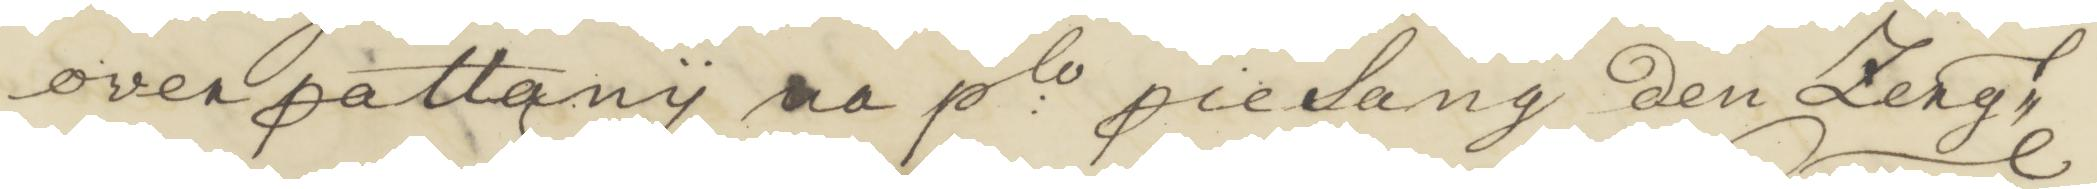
over pattanij na p:lo piesang den Zerg„t
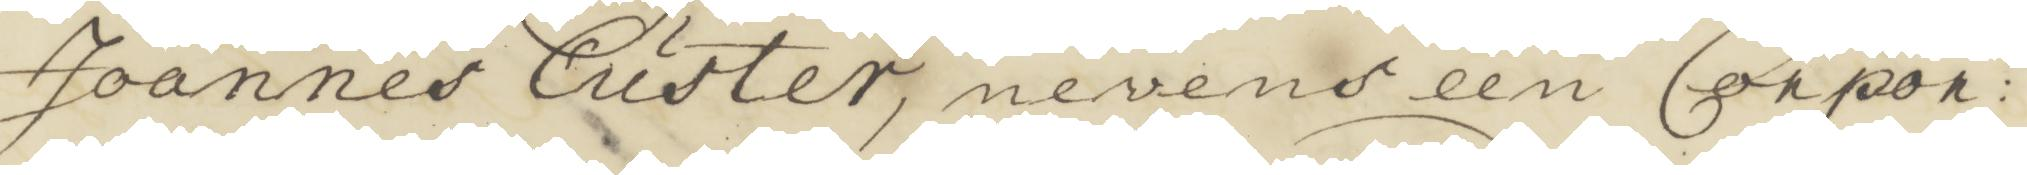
Joannes Custer, nevens een Corpor:l
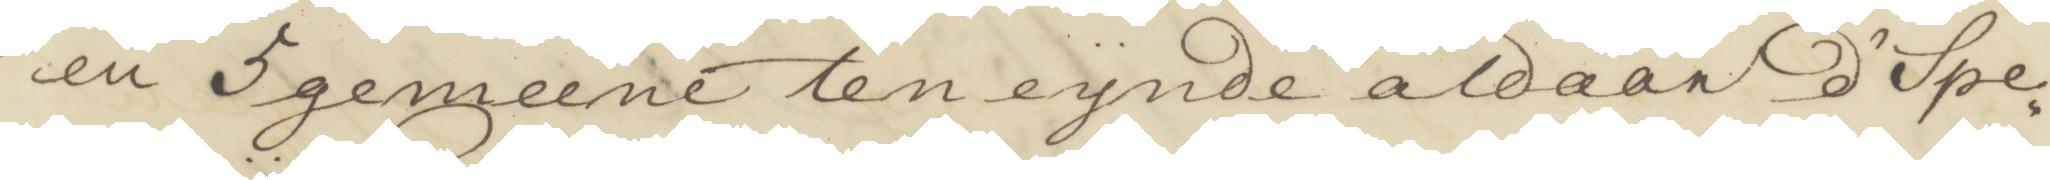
en 5 gemeene ten eijnde aldaar d’ spe
